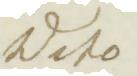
Dito . . . . . . . .
